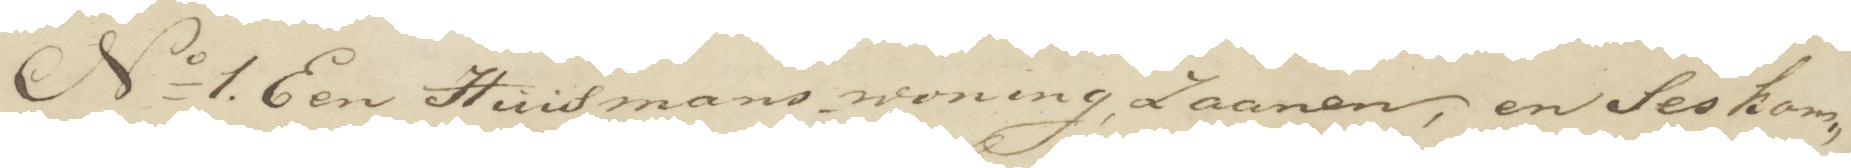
N=o 1. Een Huismans-woning, Zaanen, en Ses kam„
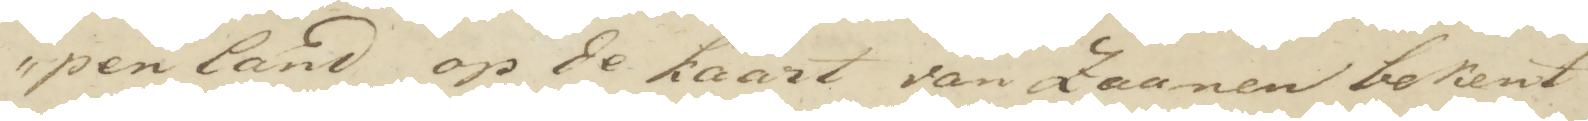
„pen land op de kaart van Zaanen bekent
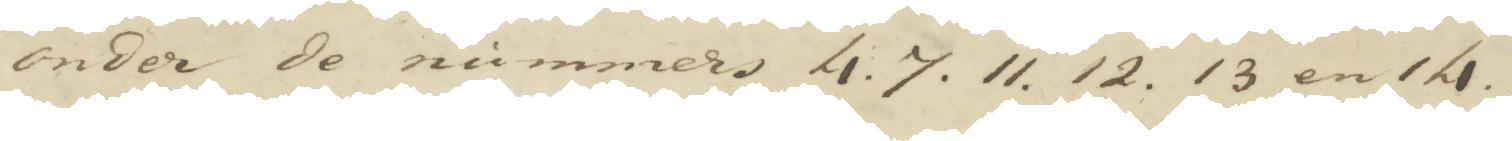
onder de nummers 4. 7. 11. 12. 13 en 14.
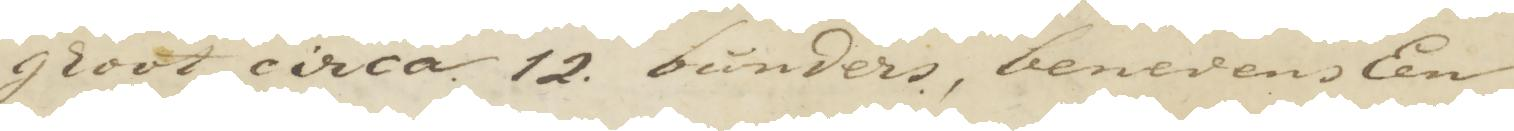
groot circa. 12. bunders, benevens Een
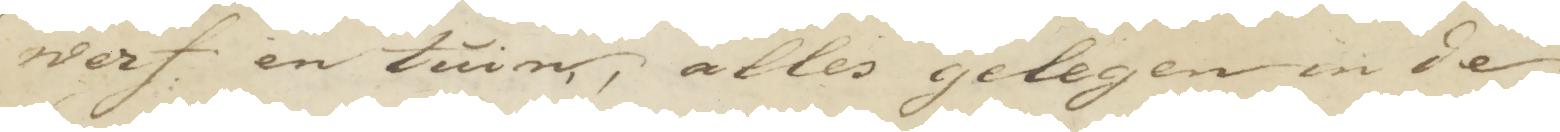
werf en tuin, alles gelegen in de
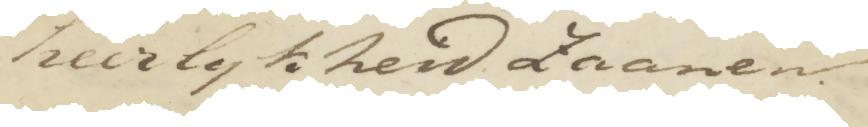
heerlykheid Zaanen.
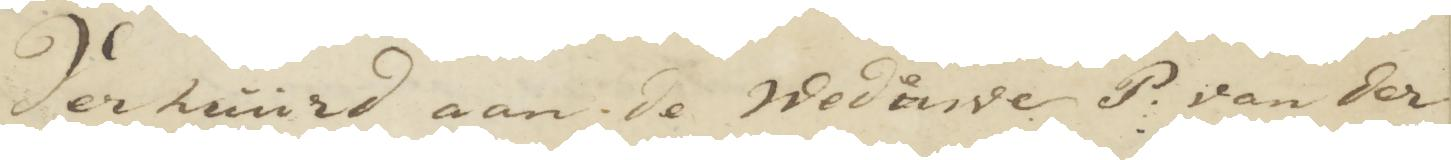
Verhuurd aan de Weduwe P. van der
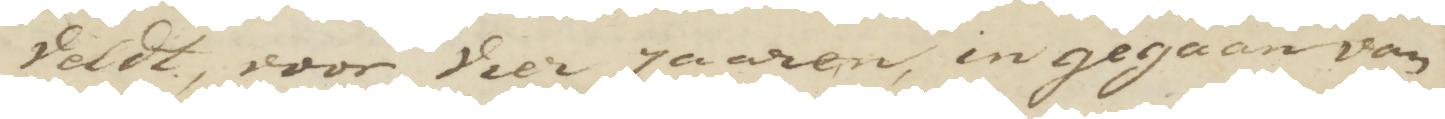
veldt, voor vier jaaren, ingegaan van
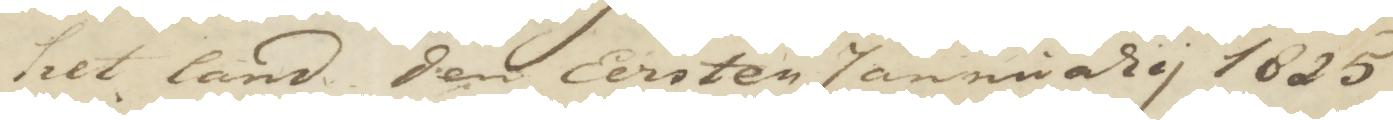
het land den Eersten Jannuarij 1825
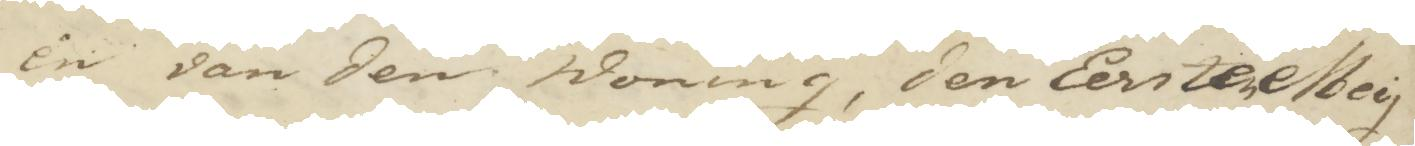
en van den Woning, den Eersten Meij
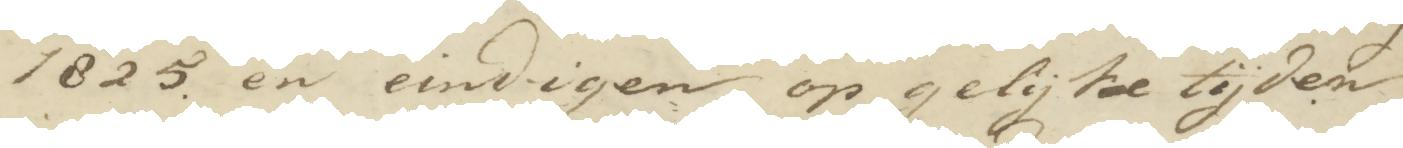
1825. en eindigen op gelijke tijden
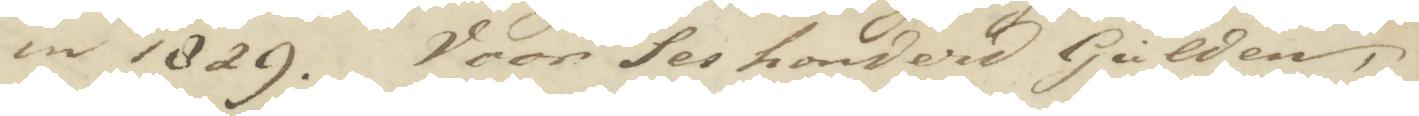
in 1829. Voor ses honderd Gulden,
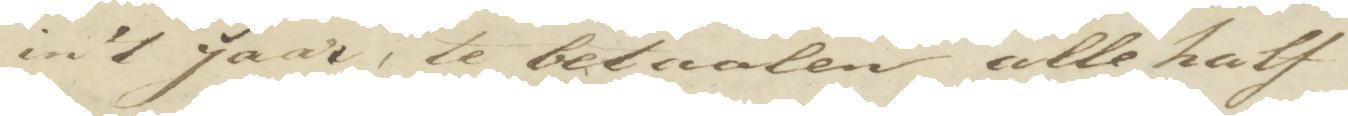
in’t jaar, te betaalen alle half
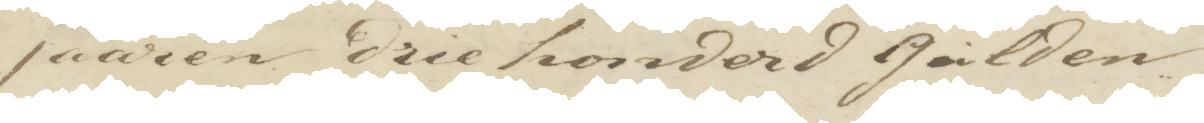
jaaren drie honderd gulden.
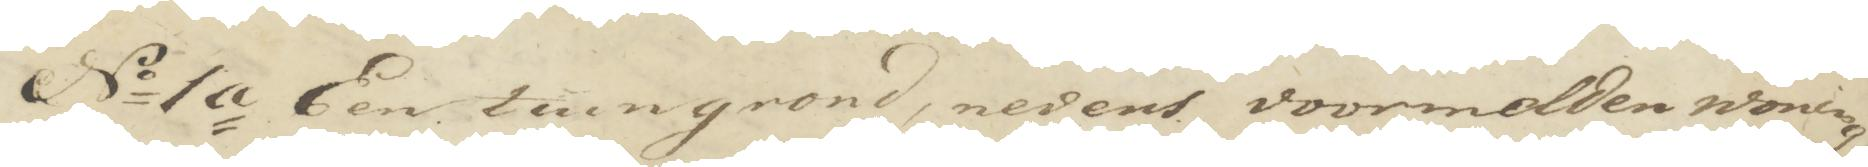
N=o 1a Een tuingrond, nevens voormelden woning,
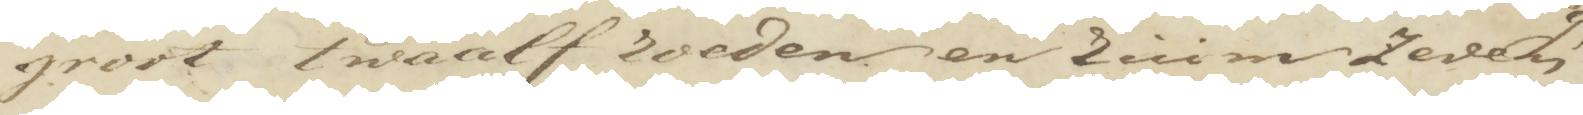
groot twaalf roeden en ruim zeven
